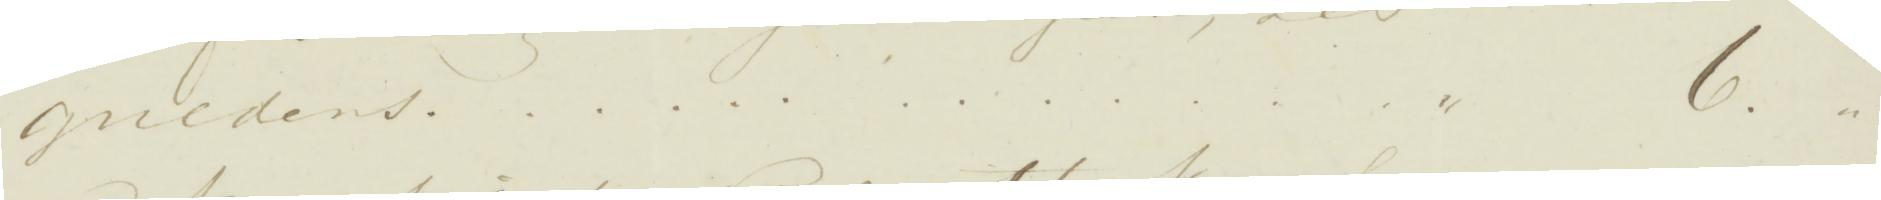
guldens. . . . . . . . . . . . . „ 6. „
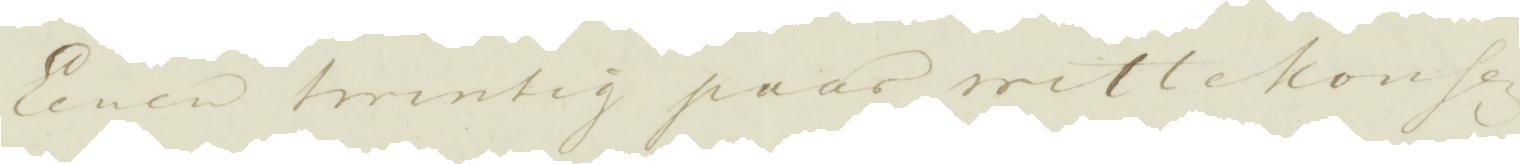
Eenen twintig paar wittekousen
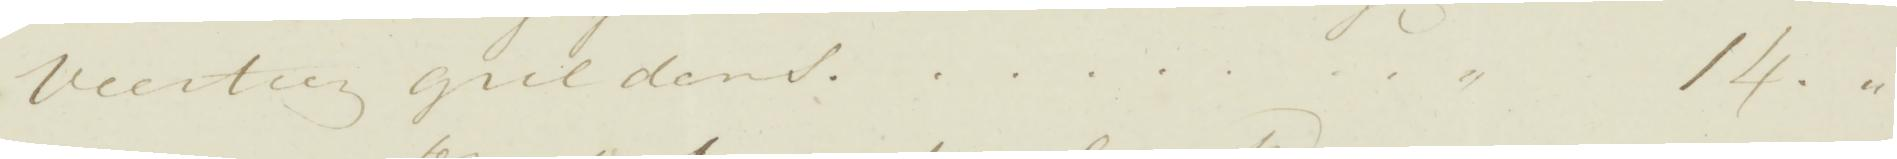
veertien guldens. . . . . . . . „ 14. „
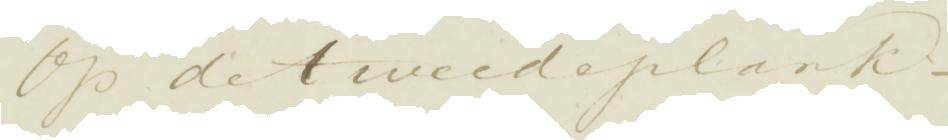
Op de tweedeplank
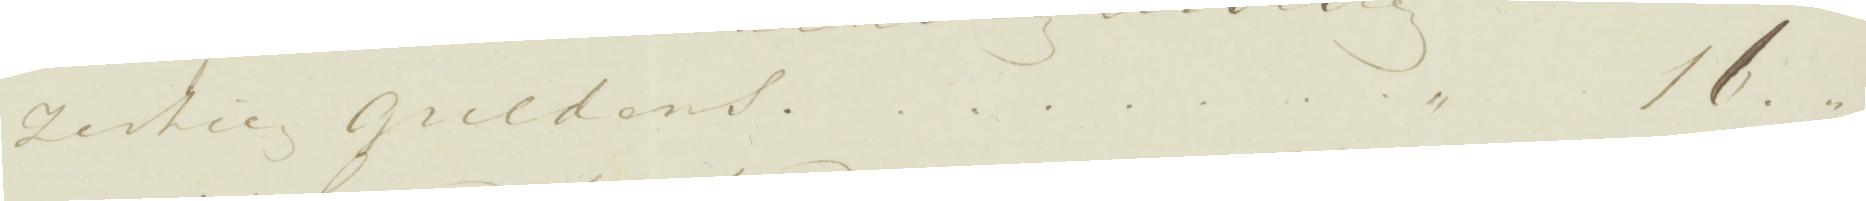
Zestien guldens. . . . . . . . „16. „
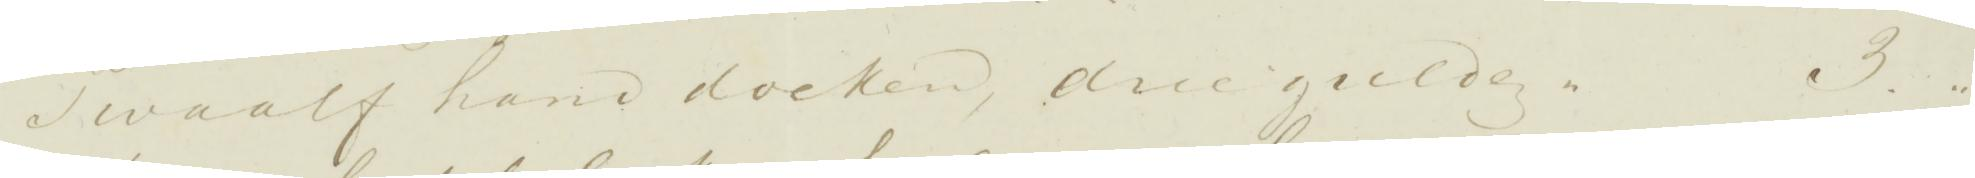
Twaalf hand doeken, drie gulden „ 3. „
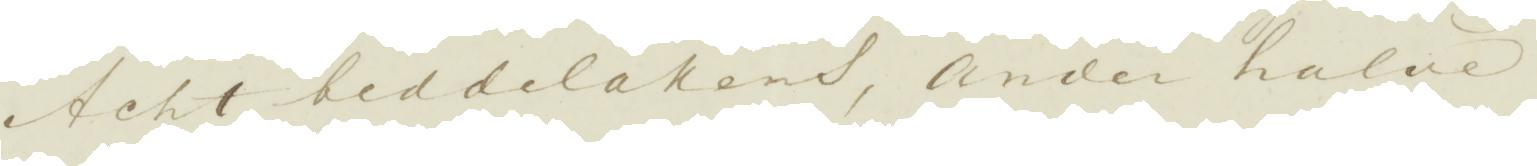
Acht beddelakens, ander halve
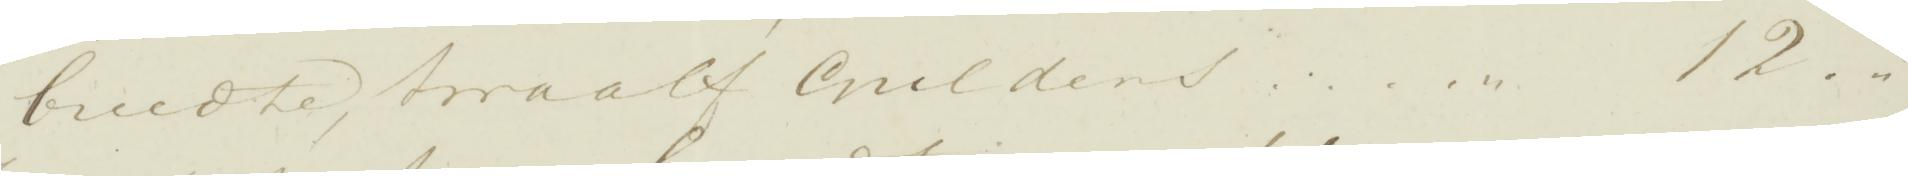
breedte, twaalf Guldens . . . . „ 12. „
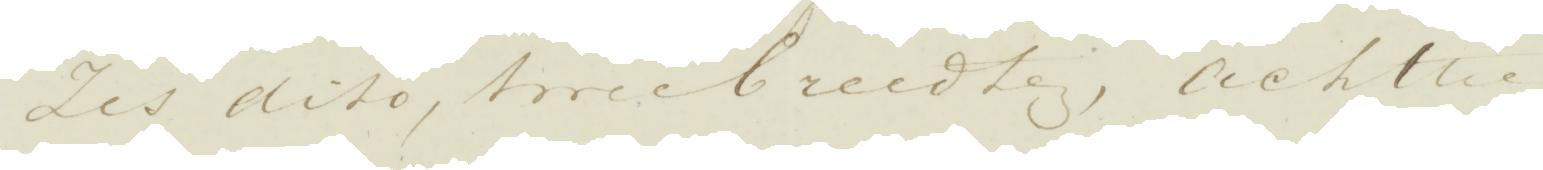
Zes dito, twee breedten. achttien
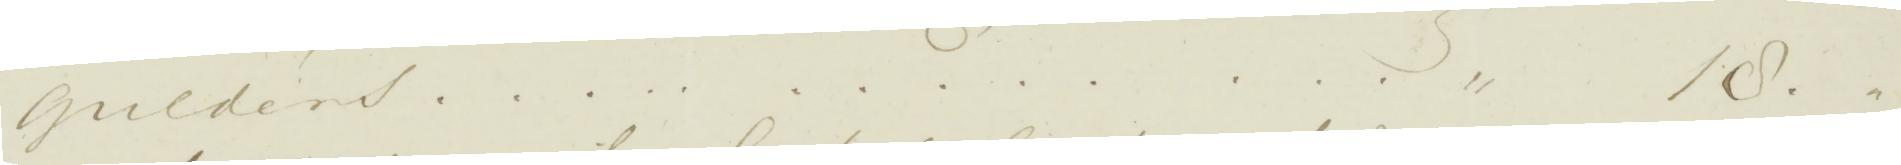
guldens . . . . . . . . . . . . . „ 18. „
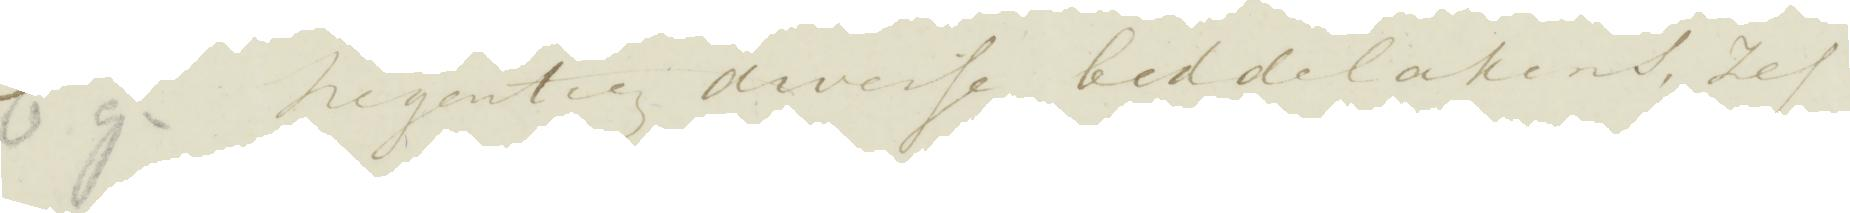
6 gn negentien diverse beddelakens, zes
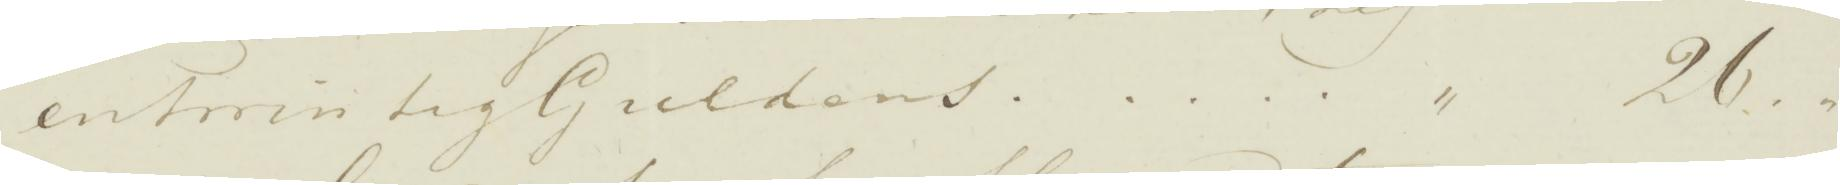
entwintig Guldens . . . . . „ 26.
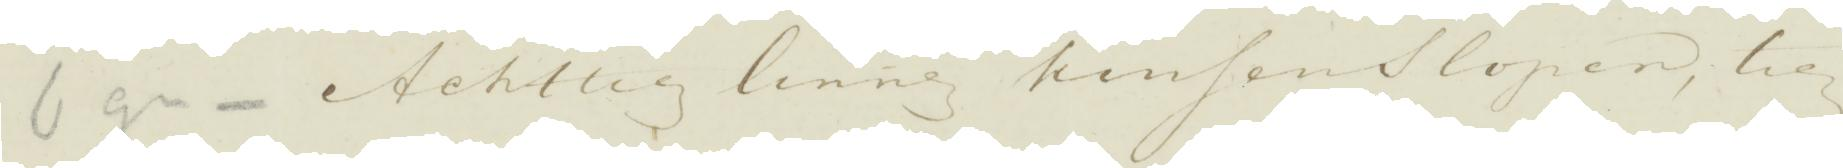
6 gn — Achttien linnen kussenslopen, tien
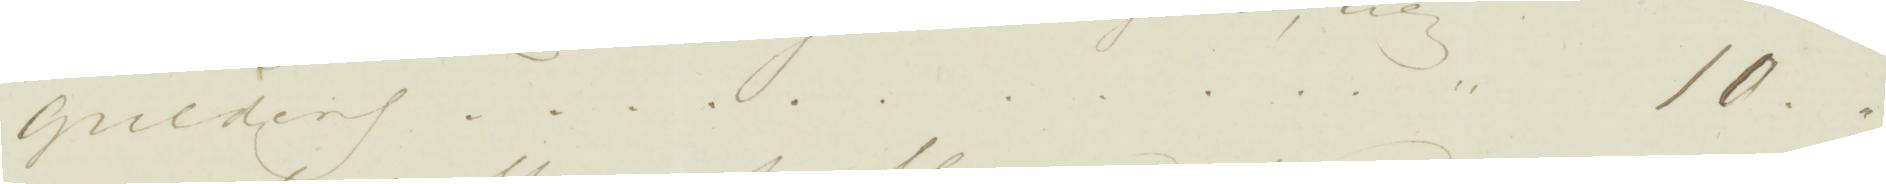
guldens . . . . . . . . . . . „ 10. „
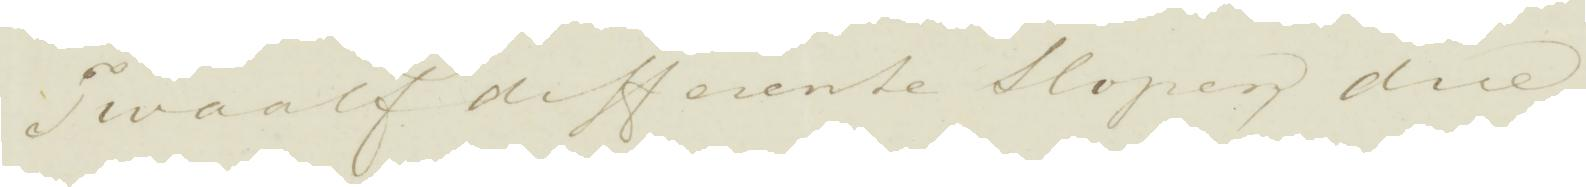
Twaalf differente slopen, drie
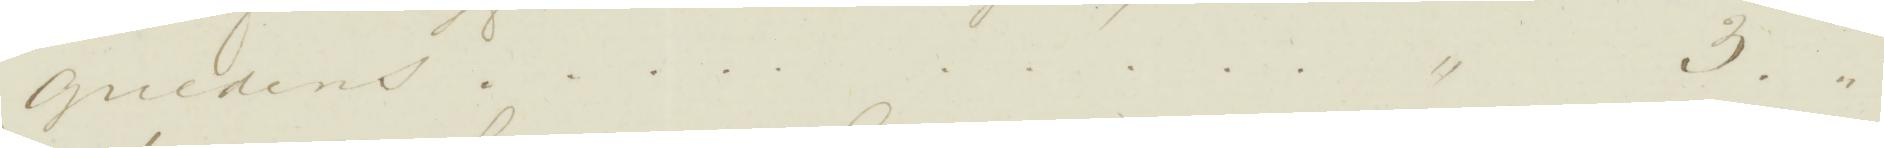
guldens . . . . . . . . . . „ 3. „
